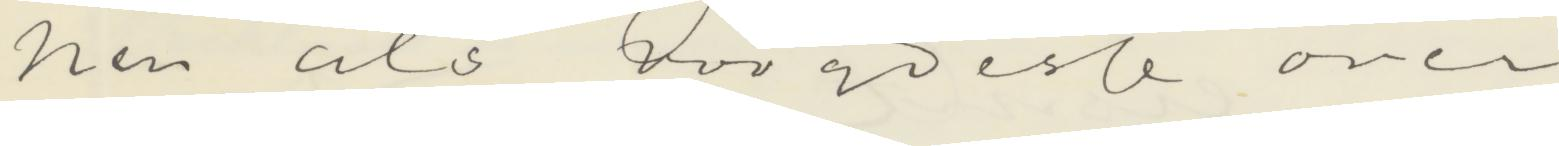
nen als voogdesse over
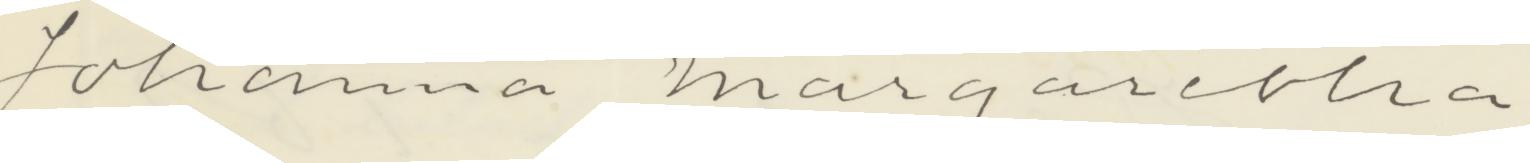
Johanna Margaretha
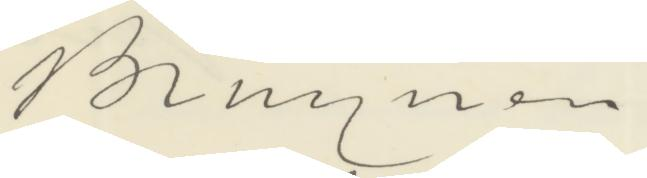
Bruynen
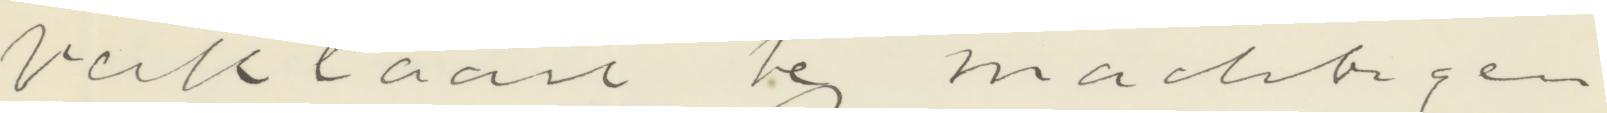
verklaart te machtigen
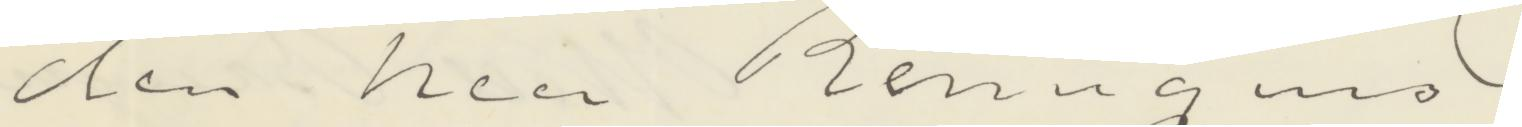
den heer Renngens
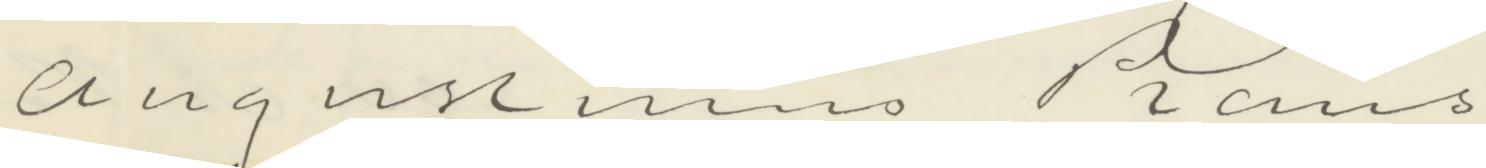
augustinus Frans
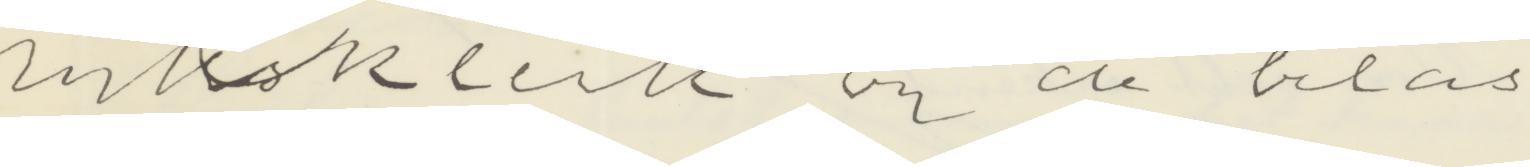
ryksklerk by de belas
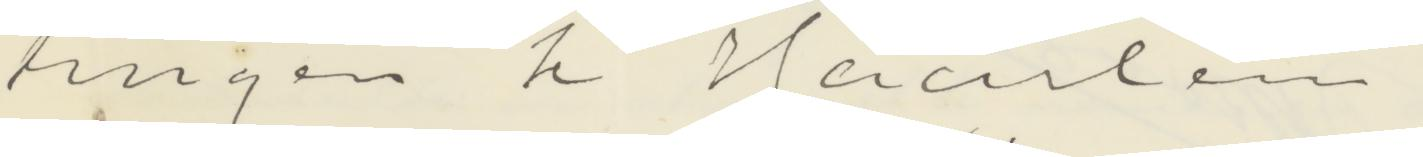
tingen te Haarlem
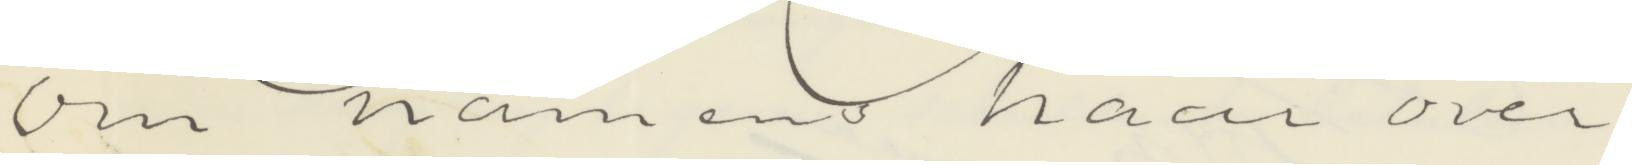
om namens haar over
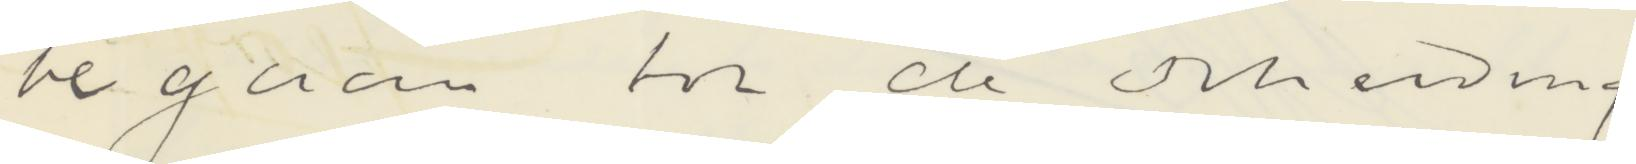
te gaan te de scheiding
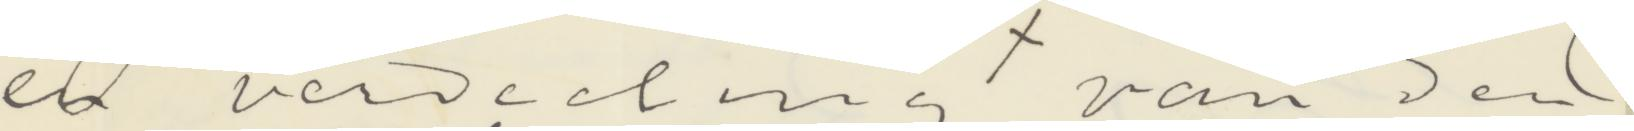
en verdeeling ¶ van den
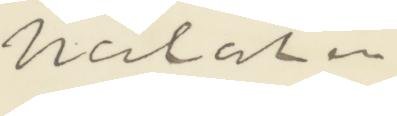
nalaten
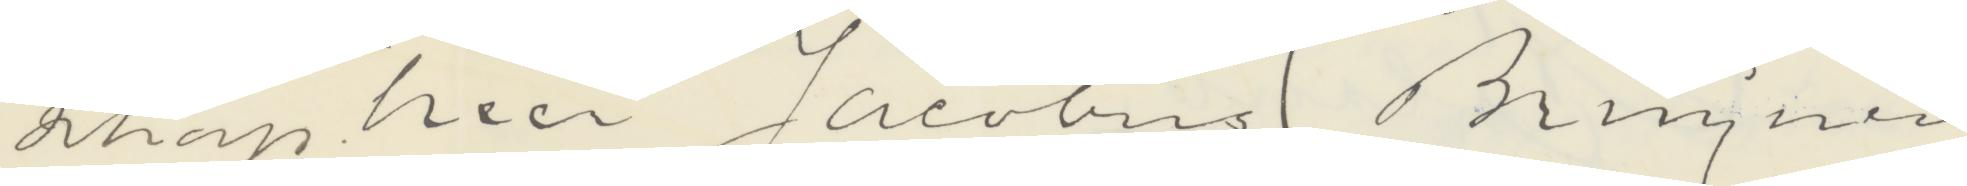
schap heer Jacobus Bruijnen
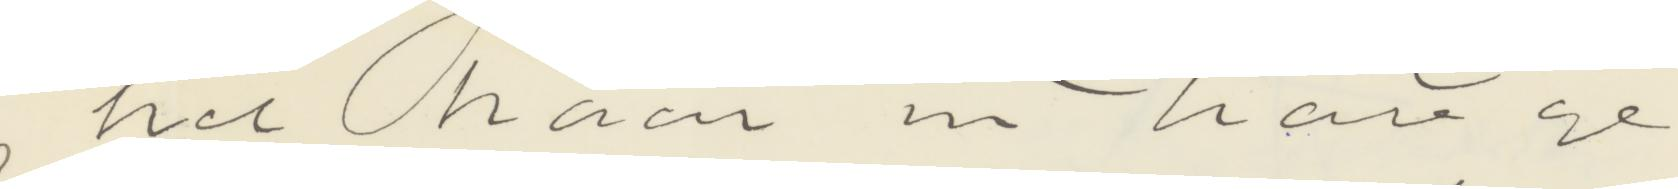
het haar in hare ge
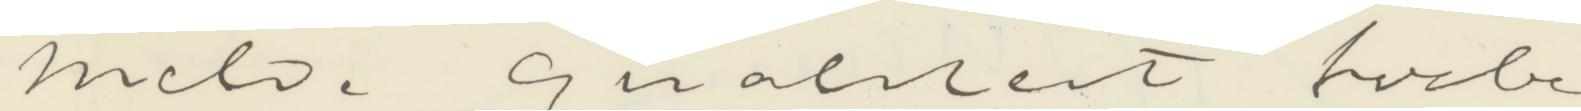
melde qualiteit toebe
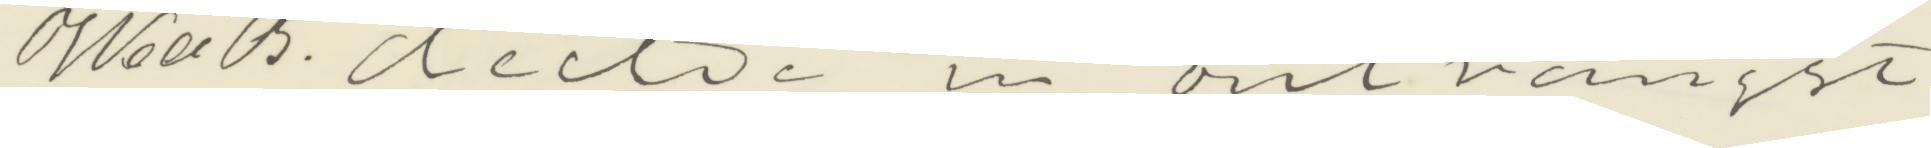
deelde in ontvangst
